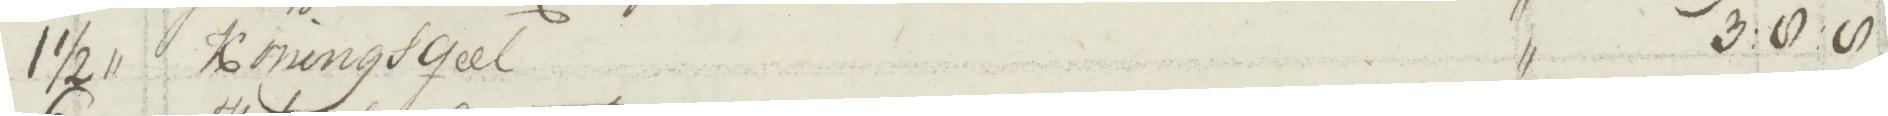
1½„ Koningsgeel „ 3:8:8
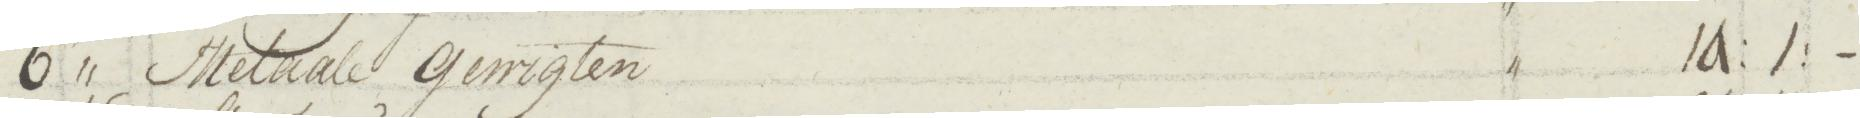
6 „ Metaale gewigten „ 14:1: -
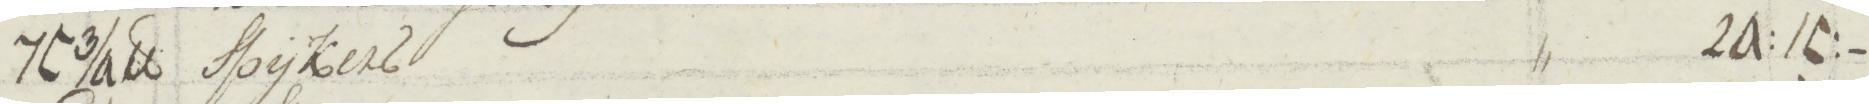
75¾lb spijkers „ 24:15:—
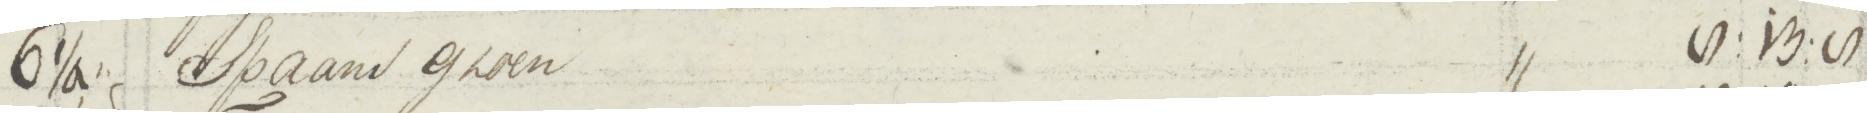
6½„ Spaans groen „ 8:13:8
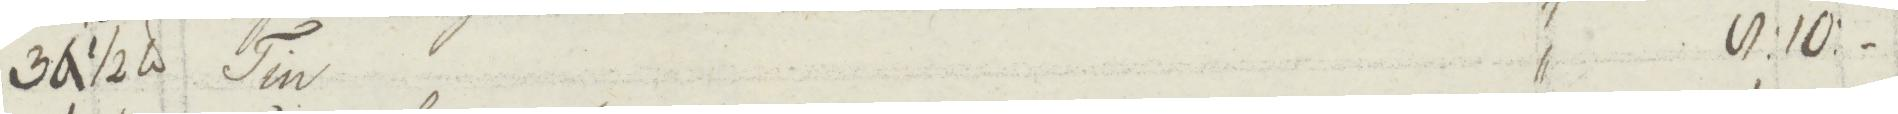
34½ lb Tin „ 8:10:—
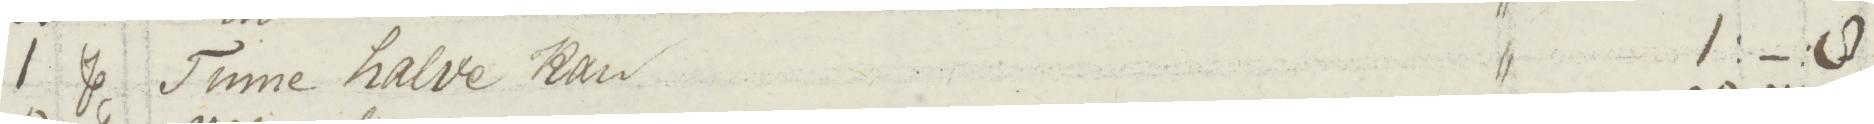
1 p Tinne halve kan „ 1:—:8
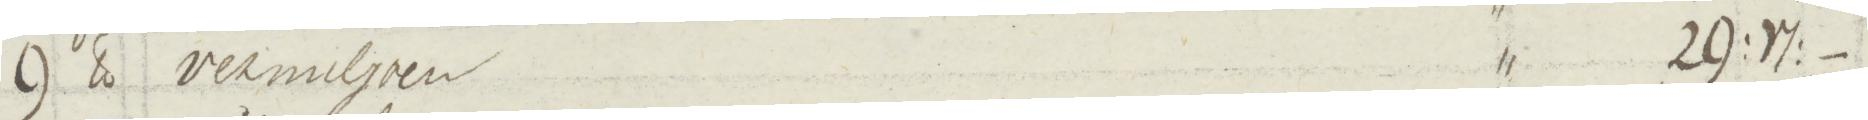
9 lb vermiljoen „ 29:17:—
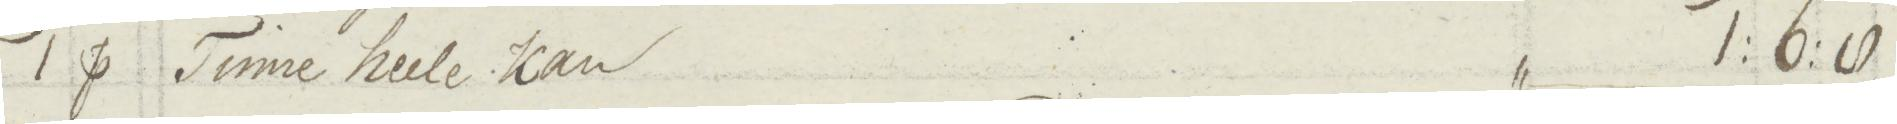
1 p Tinne heele kan „ 1:6:8
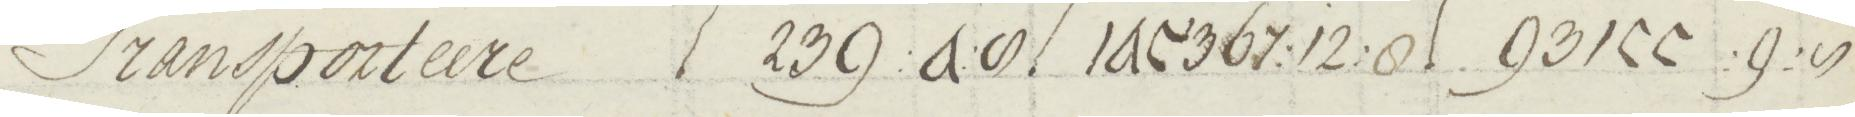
Transporteere ƒ 239:4:8ƒ 145367:12:8 ƒ 93155:9:8
